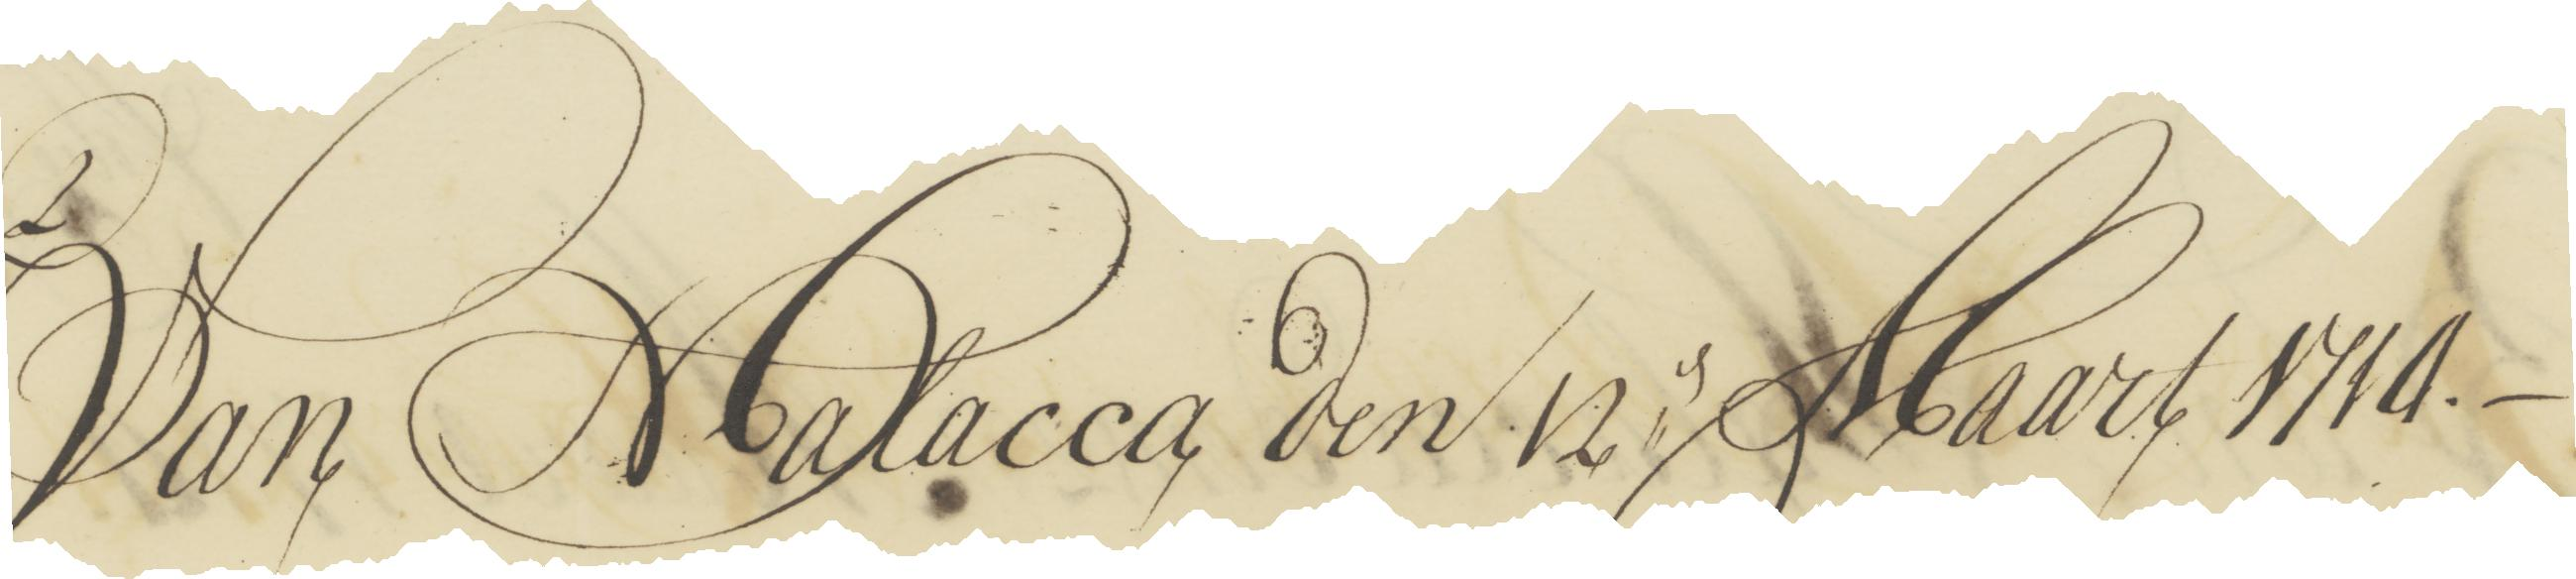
Van Malacca den 12„e Maart 1714.
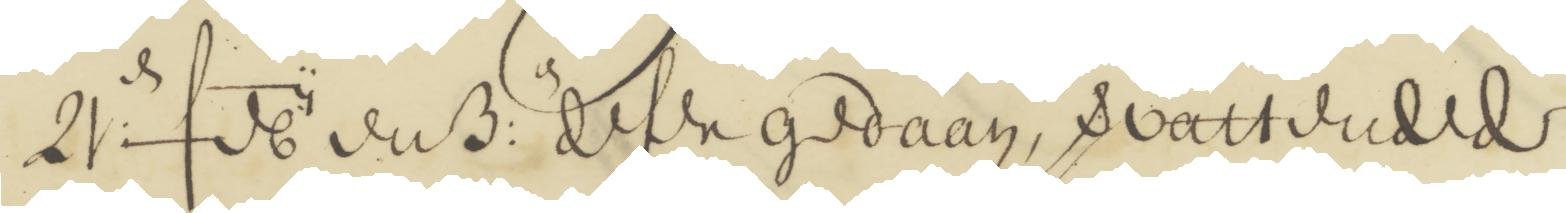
21:en febij en 3:en deser gedaan, vervattende de
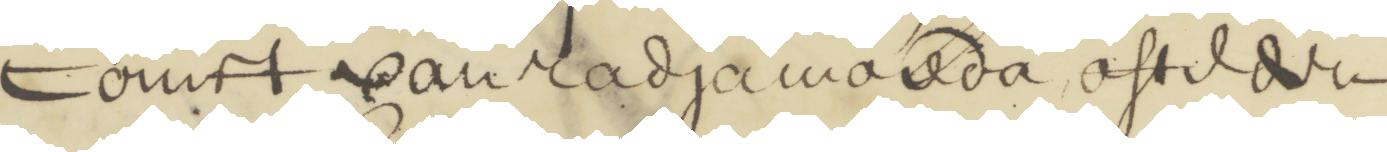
comst van radja moeda ofte den
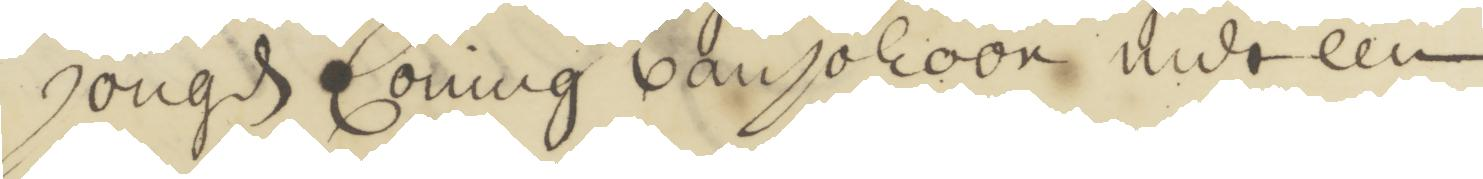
jongen Coning van johoor met een
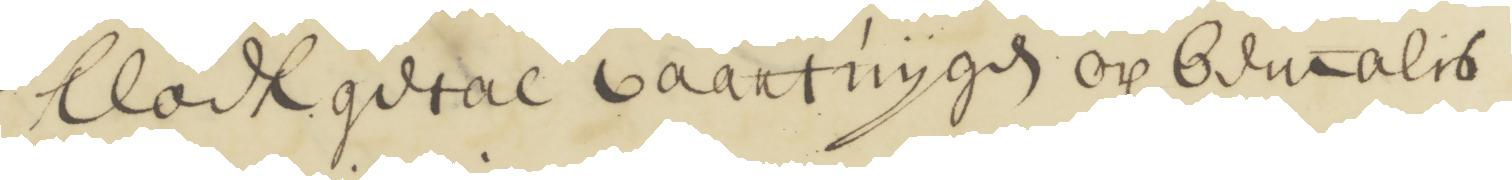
kloek getal vaartuijgen op bencalis
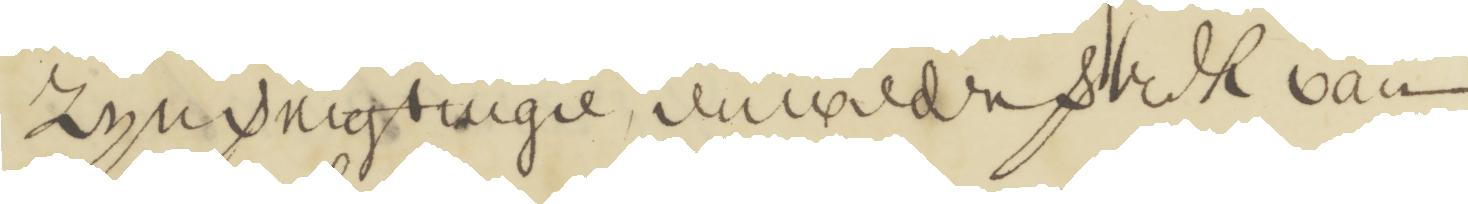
zyn verrigtinge, en weder vertrek van
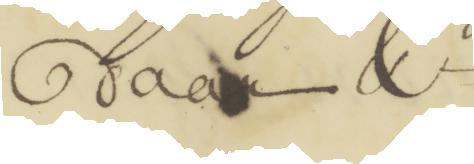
daar &=a
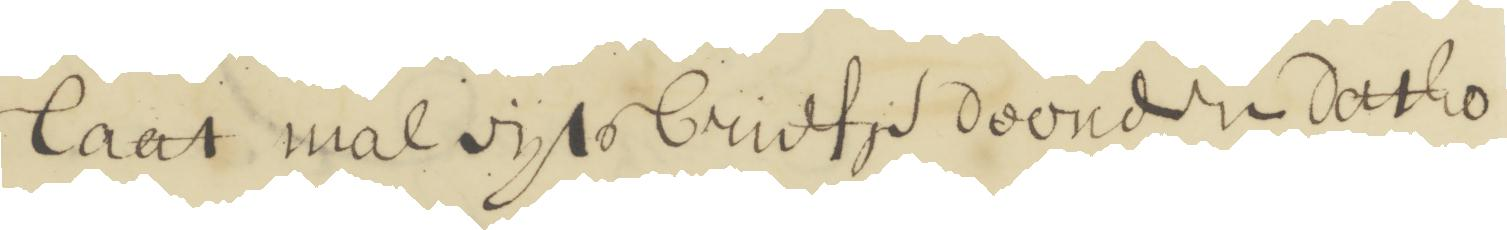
N„o 9. Copia translaat maleijtsbriefje doorden datho
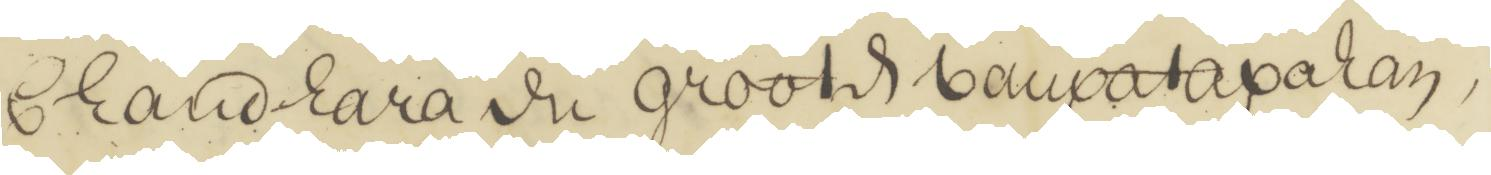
bhandhara en grooten van patapahan,
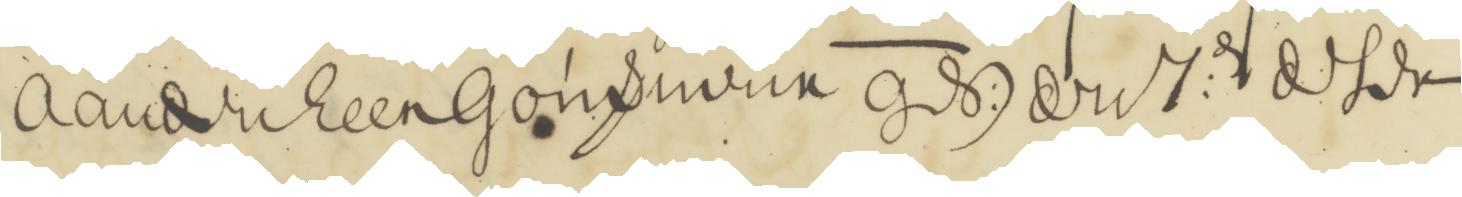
aanden heer gouverneur gelijk den 7:en deser
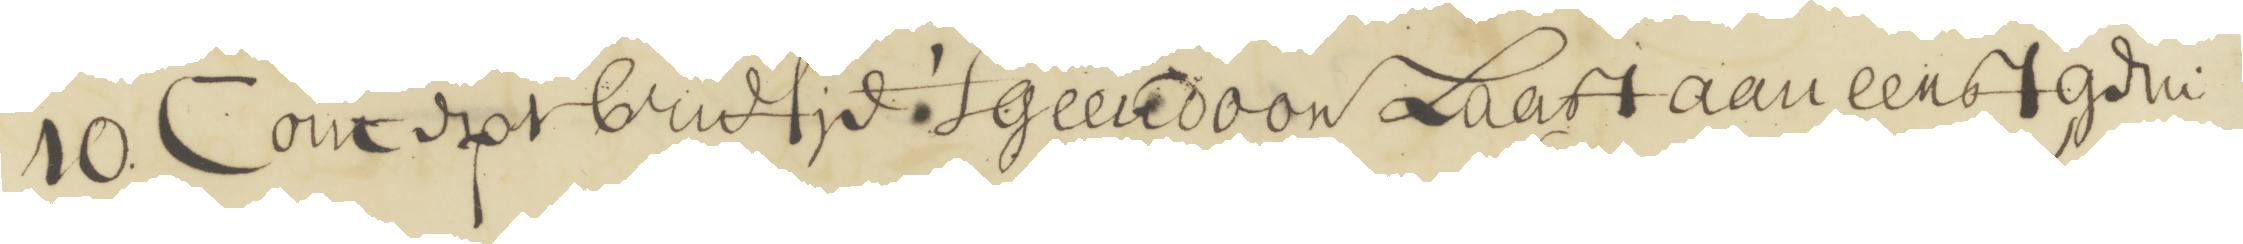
10. Conceptbriefje 't geen door laast aan eerstgem
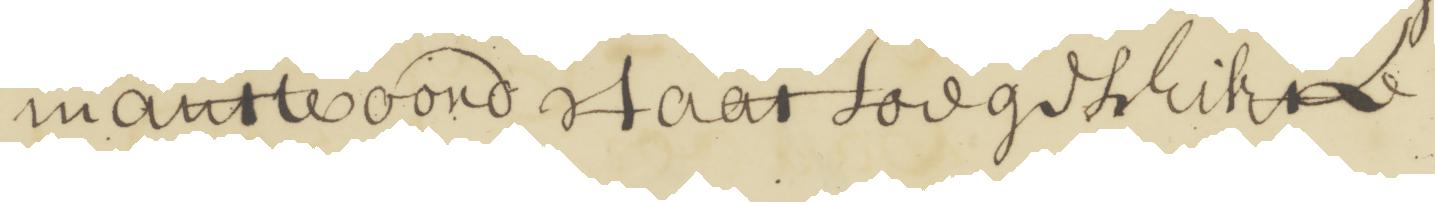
in antwoord staat toegeschikt te
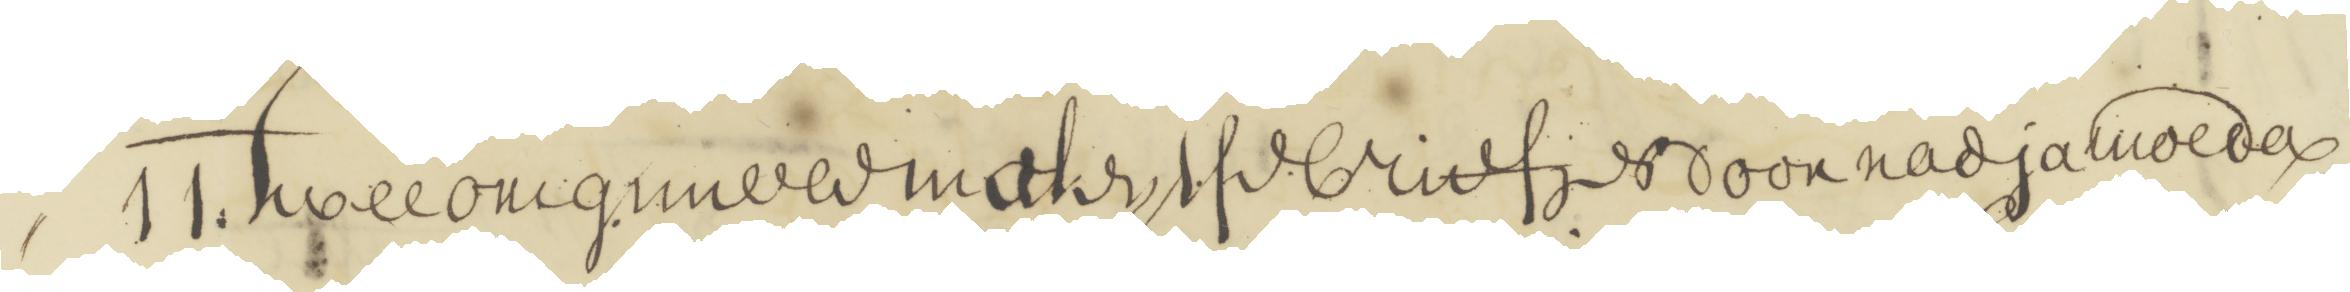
„ 11. Twee origineele maleytse briefjes door radja moeda
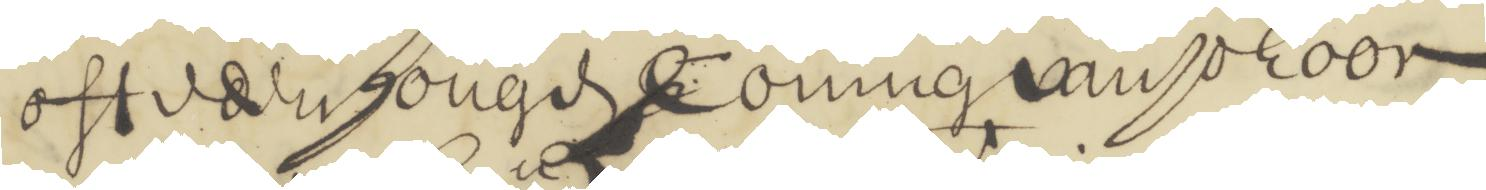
ofte den jongen Coning van johoor
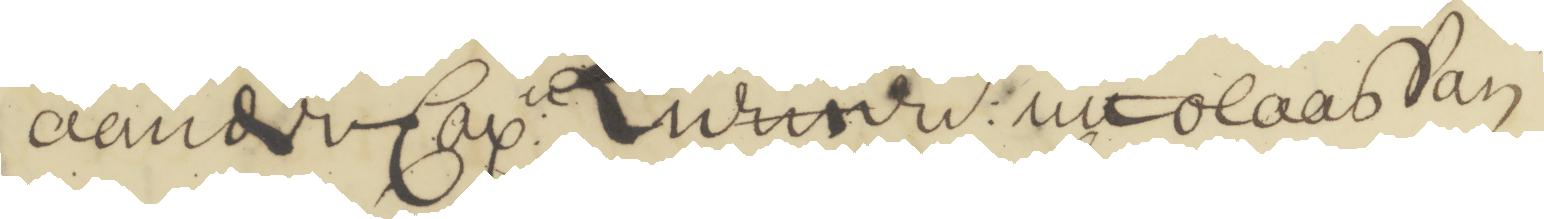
aan den Cap:n Lueiten:t nicolaas van
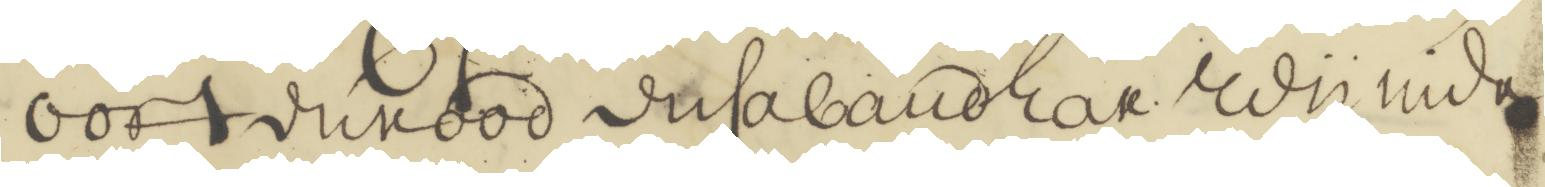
oostenrood en sabandhar reijnier
